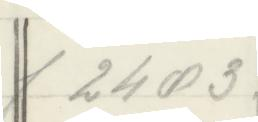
ƒ 2483
